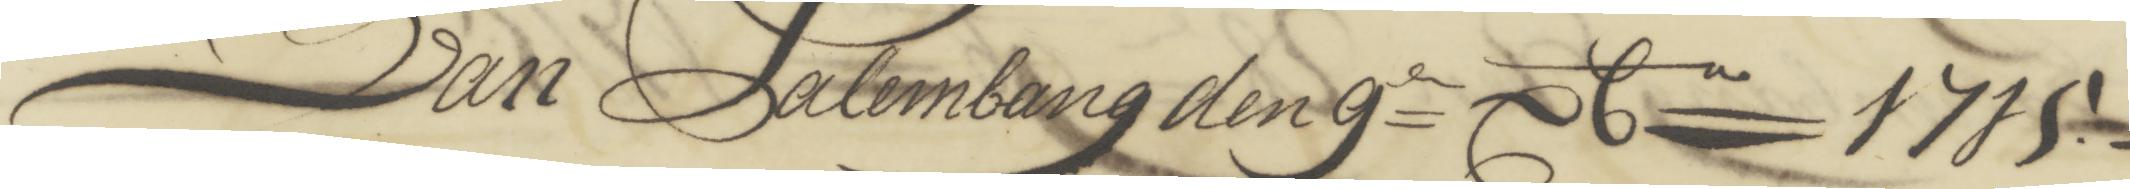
Van Palembang den 9=en xb=r 1715. —
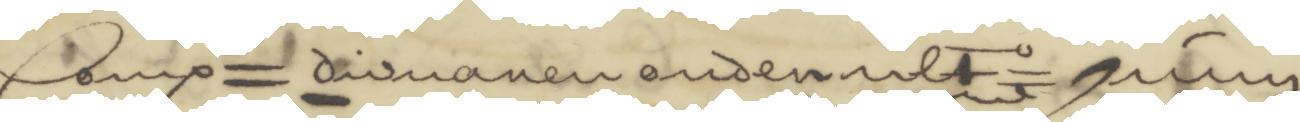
Comp=s dienaren onder ult=o junij
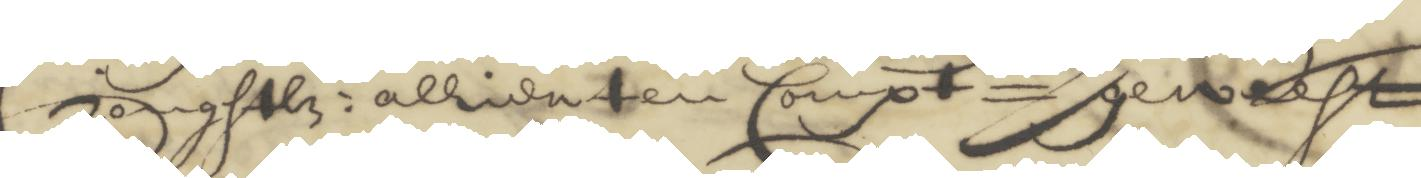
jongstl: alhier ten Compt=e geweest
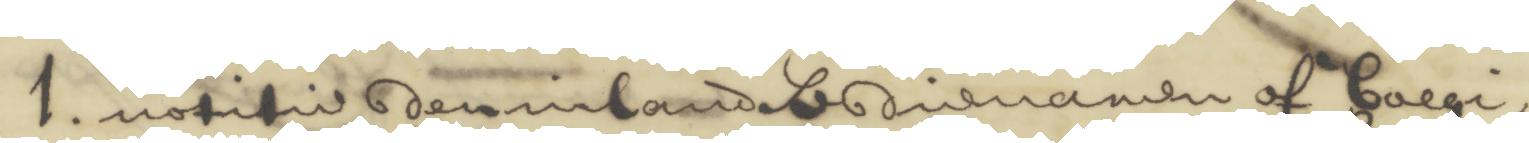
1. notitie den inlandse dienaren of boegi„
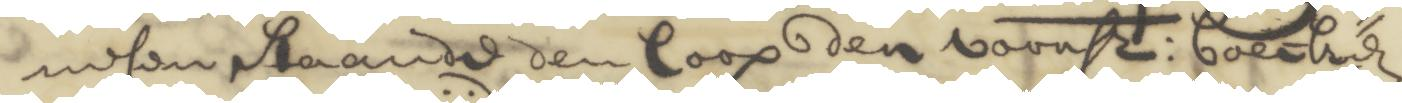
nesen staande den Coop der voorsz: boecken
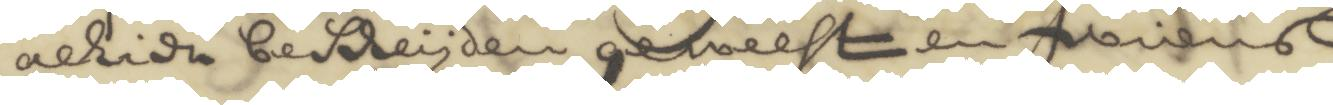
alhier bescheijden geweest en wiens
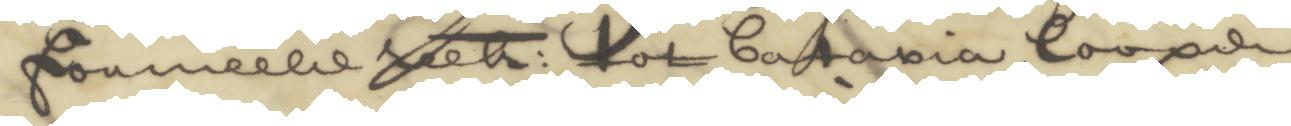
formeele reek: tot batavia Coopen
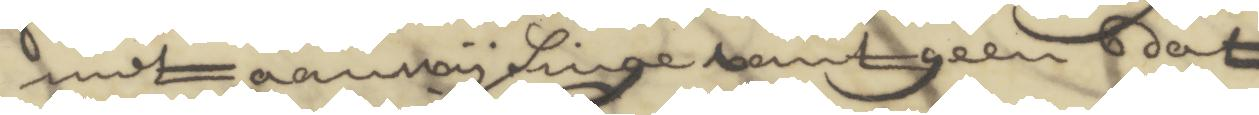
met aanwijsinge van’tgeen dat
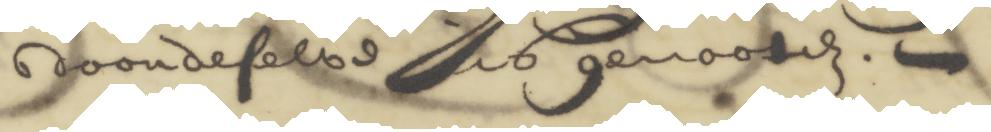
door deselve is genooten. —
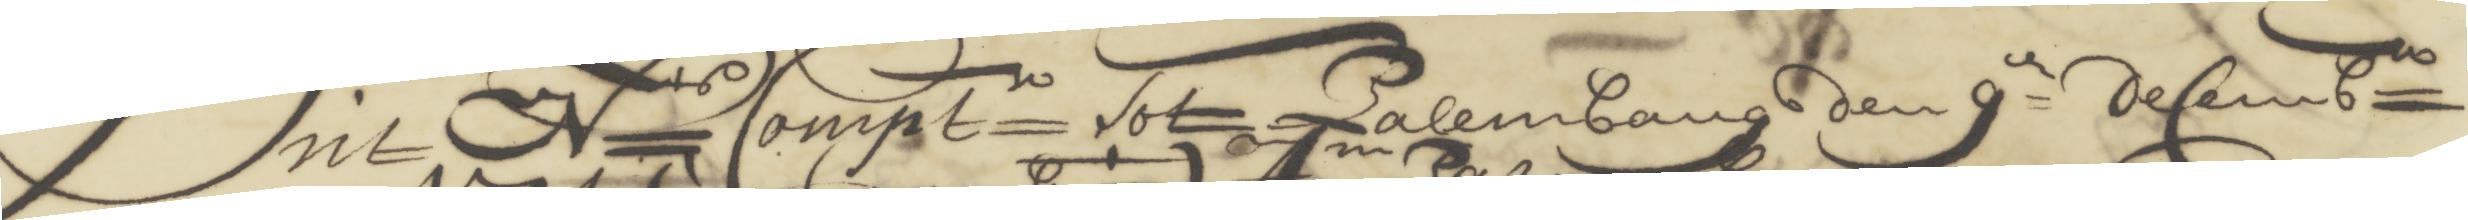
In't N=ts Compt=r tot Palembang den 9=en decemb=r
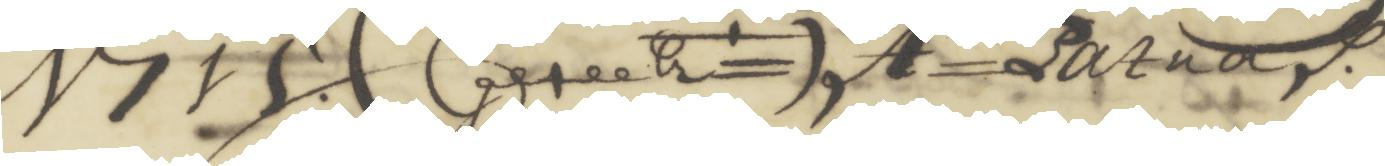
1715. (geteek=t) A=m Patras.
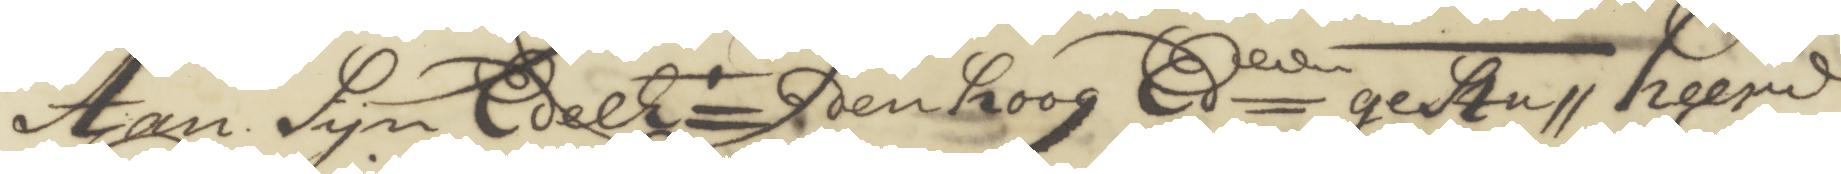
Aan sijn Edelh=t den hoog Ed=len gestr„ heere
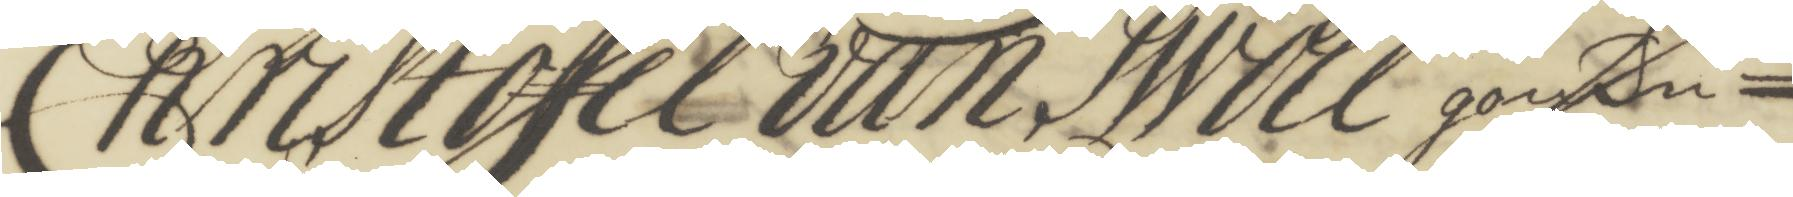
Christoffel van Swoll gouvern=r
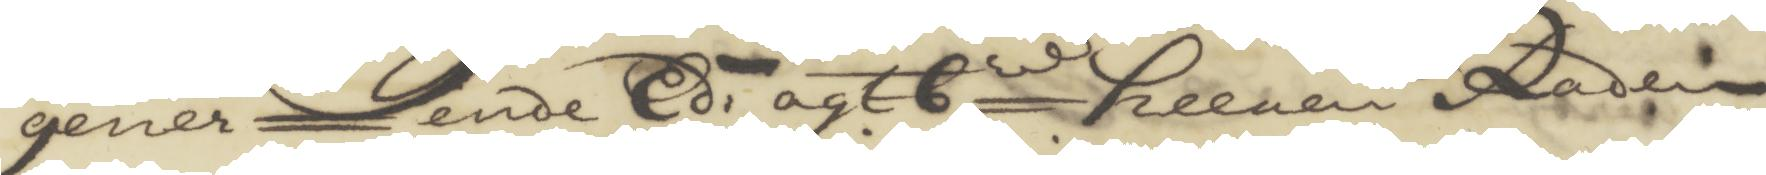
gener=l ende Ed: agtb=re heeren Raden
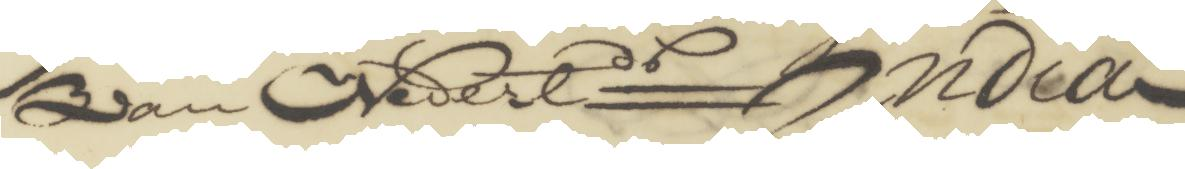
van Nederl=ds jndia—
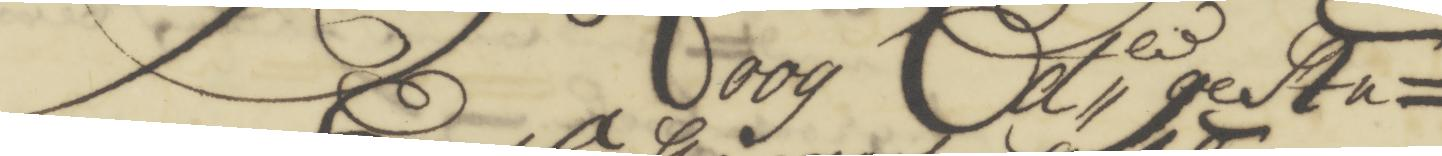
Hoog Ed„le gestr=
